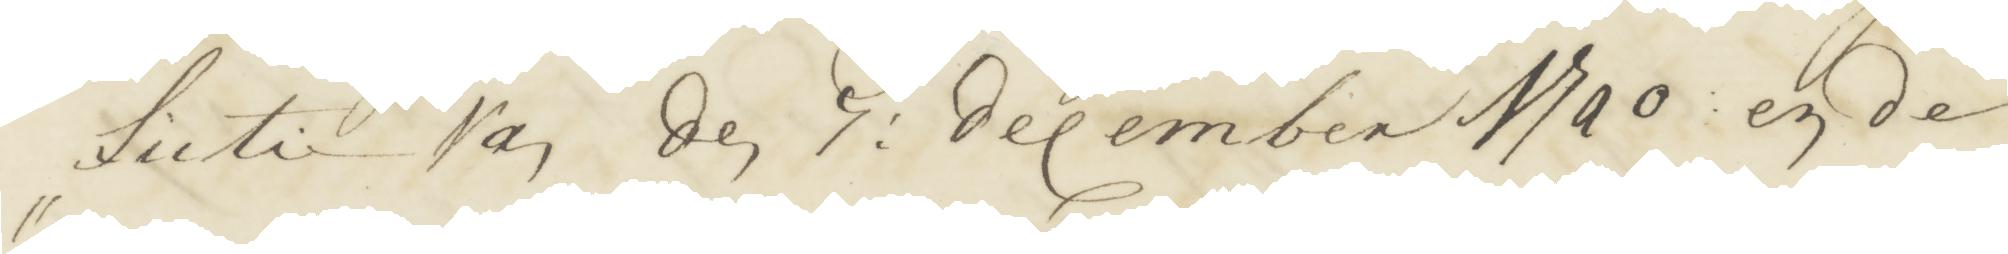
„lutie van den 7: december 1740: en de
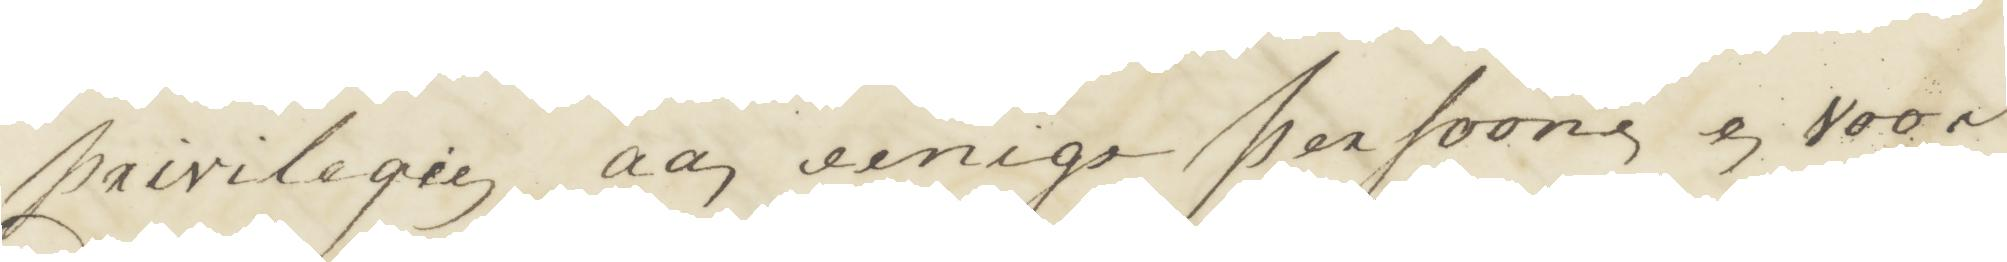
privilegie aan eenige persoonen en voor
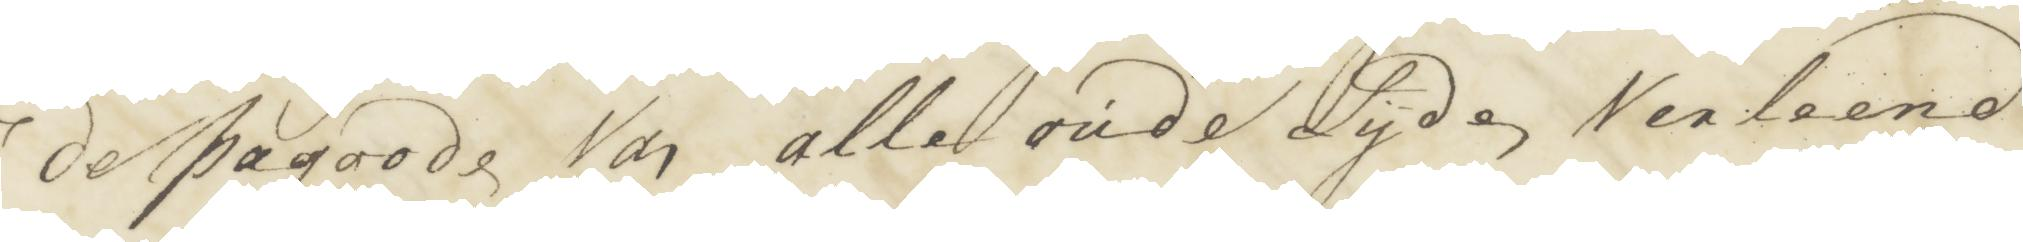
de pagoode van alle oude zijden verleend
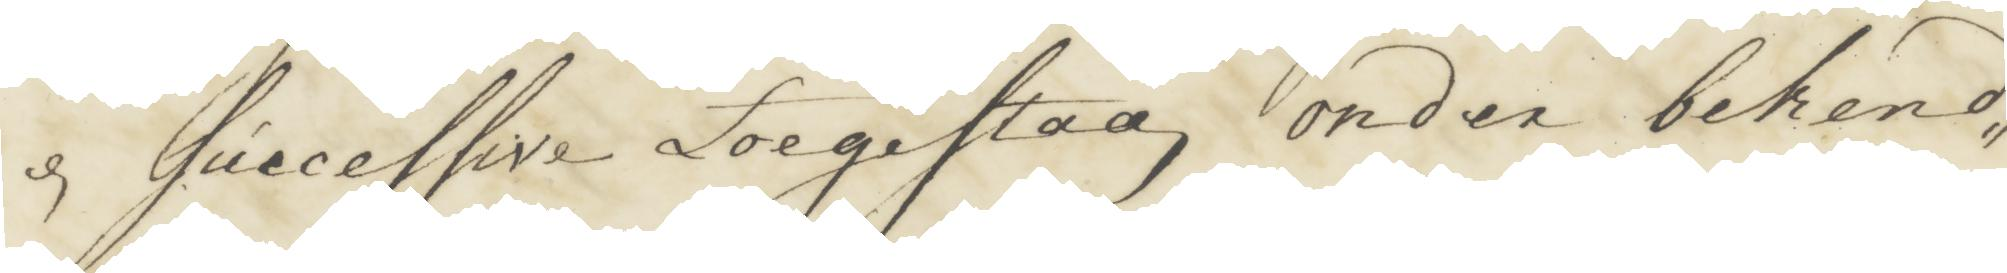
en successive toegestaan onder bekend„
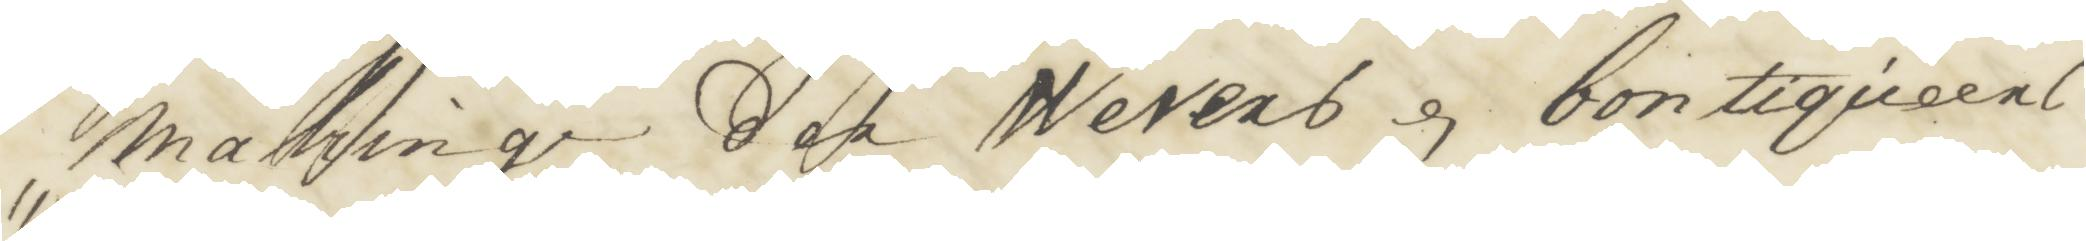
„makinge der wevers en boutiqueers
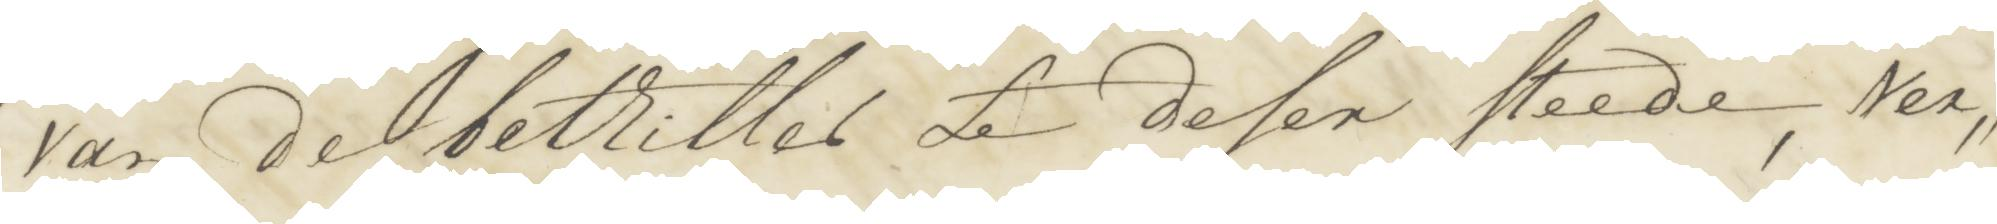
van de bethilles te deser steede, ver„
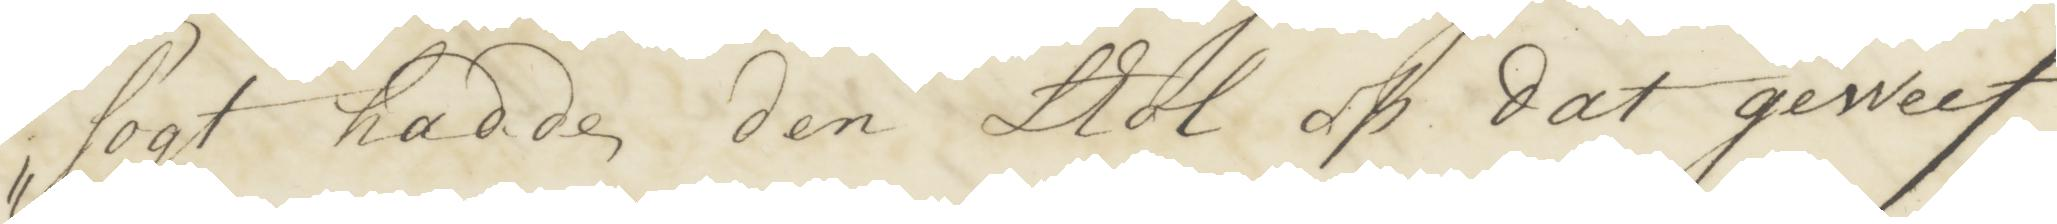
„sogt hadden den thol op dat geweef
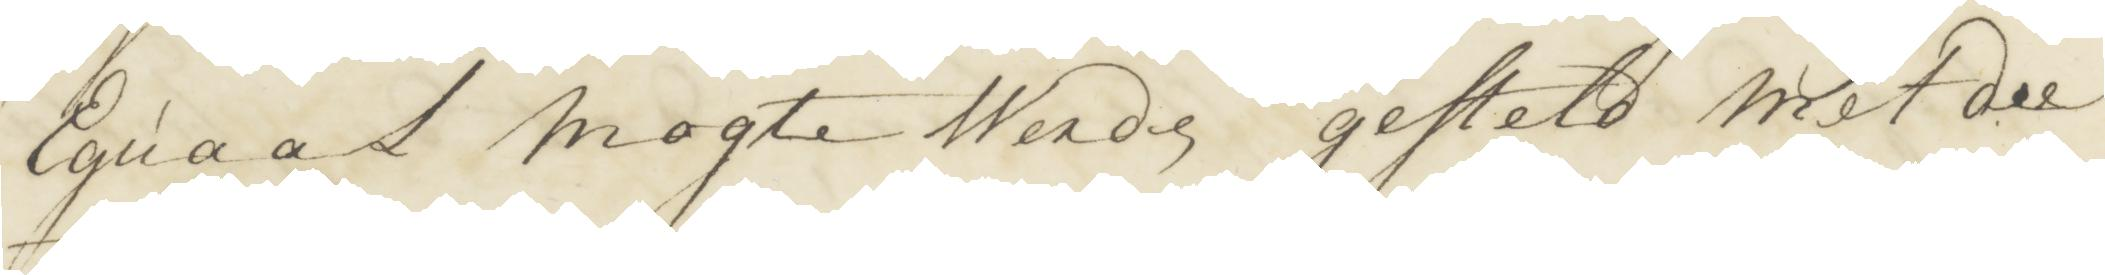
Equaal mogte werden gesteld met die
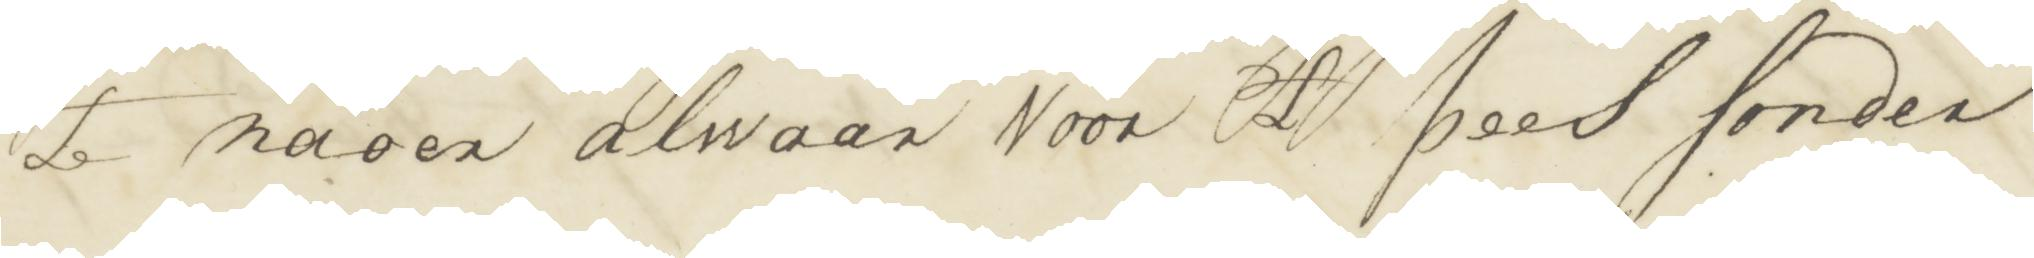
te naoer alwaar voor 't pees sonder
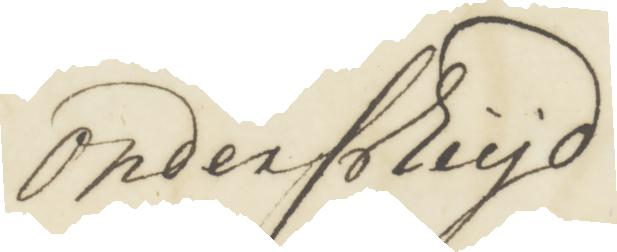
onderscheijd
